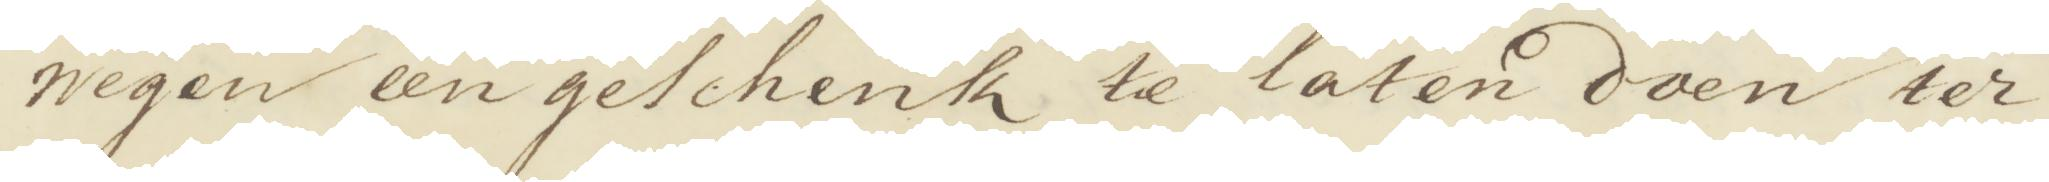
wegen een geschenk te laten doen ter
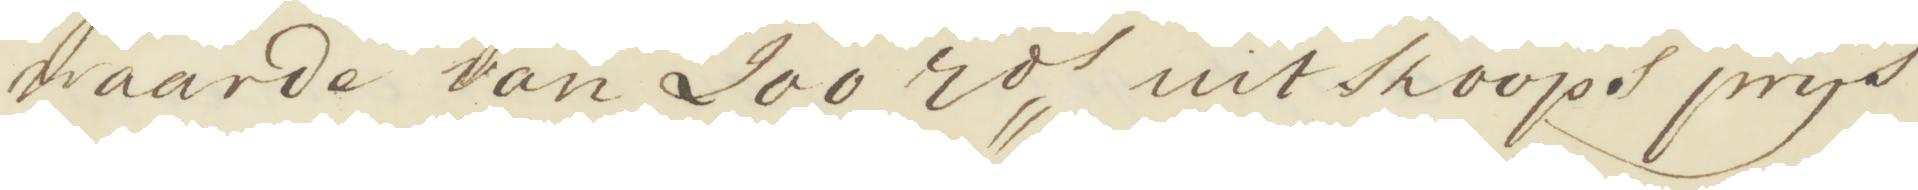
waarde van 200 rd„s uitkoops prys
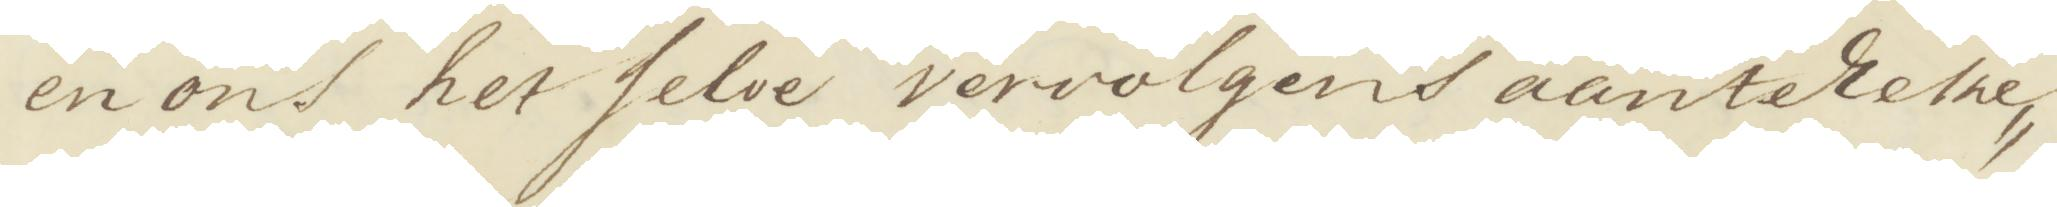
en ons het selve vervolgens aantereke„
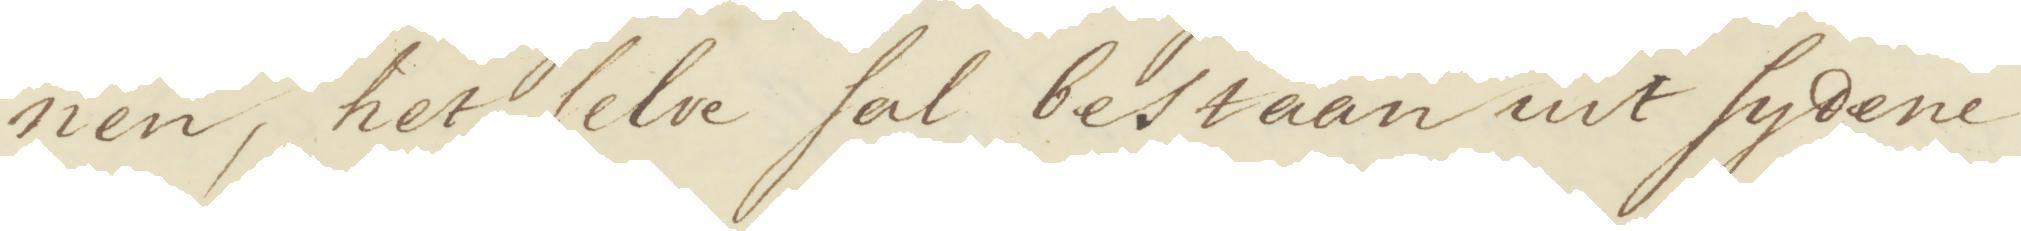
nen, het selve sal bestaan uit sydene
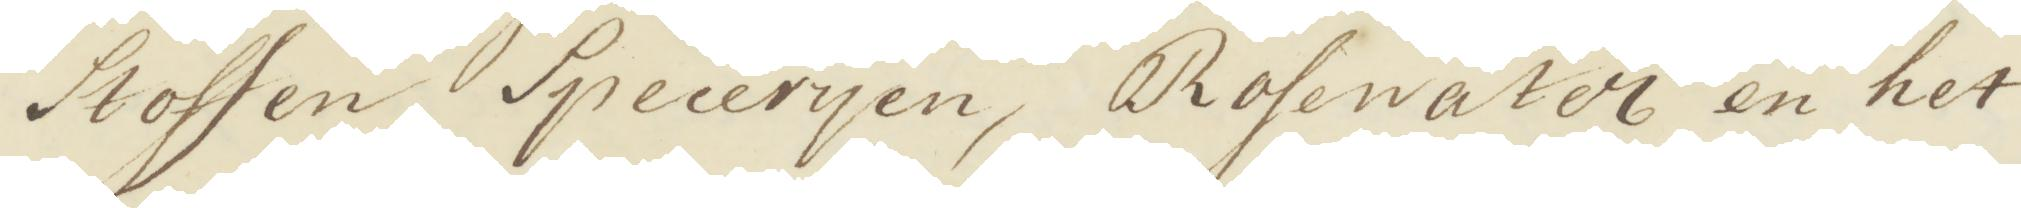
stoffen, speceryen, Rosewater en het
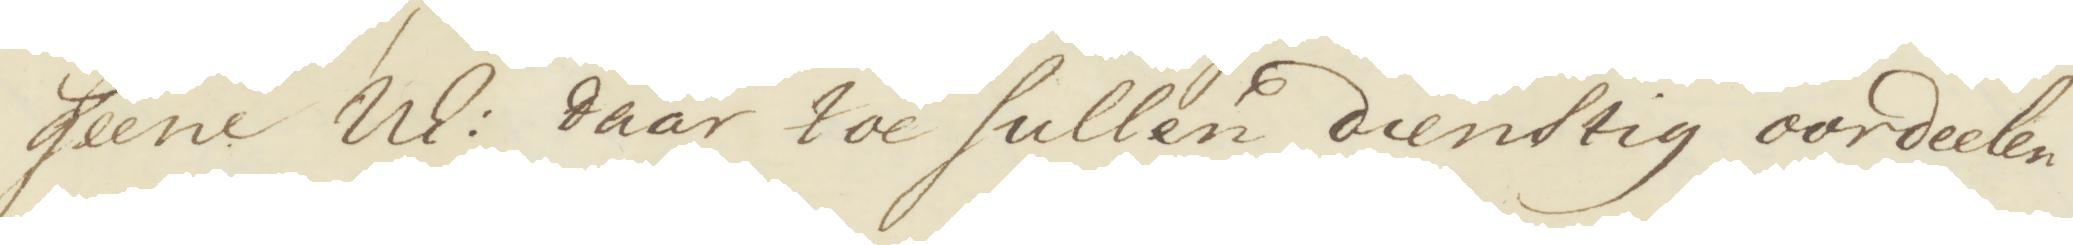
geene UE: daar toe sullen dienstig oordeelen
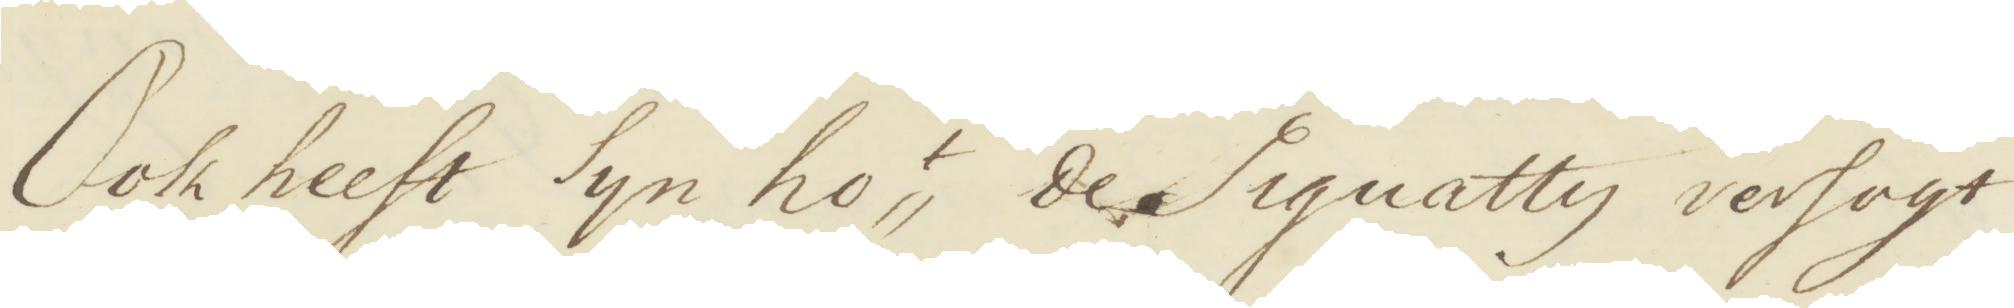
Ook heeft syn ho„t de signatty versogt
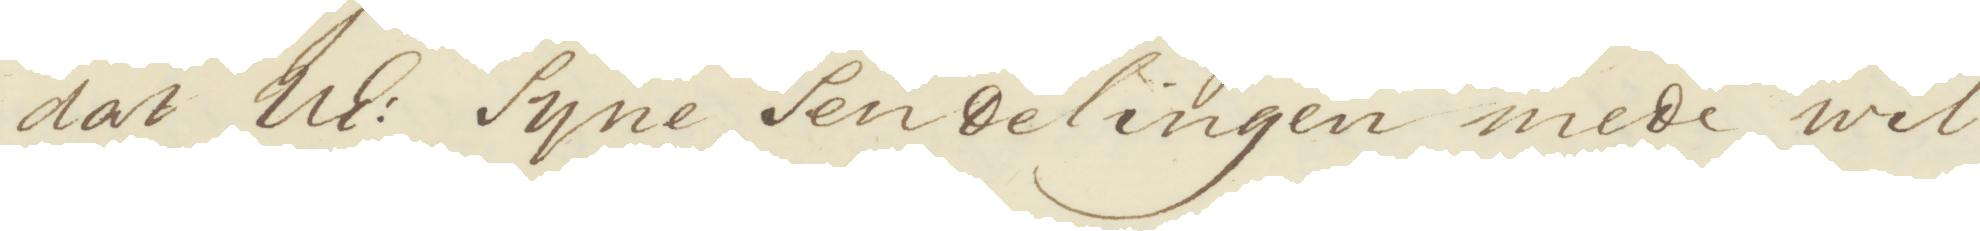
dat UE: sijne sendelingen mede wil
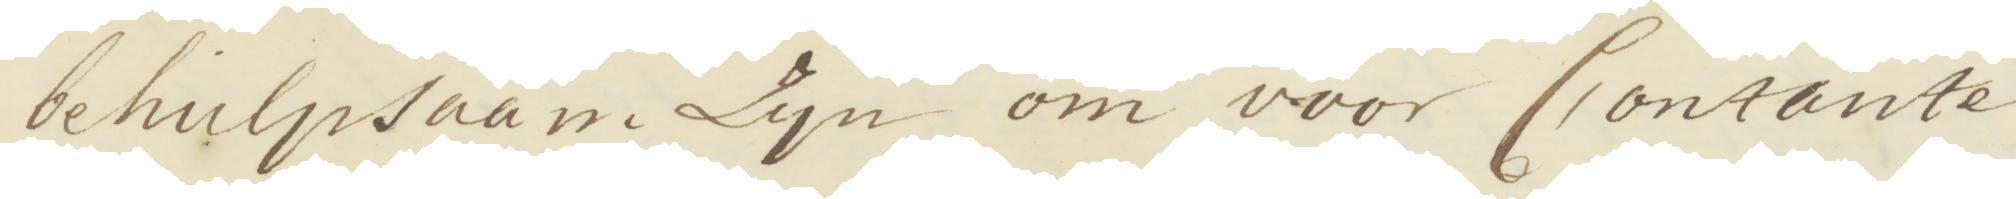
behulpsaam zyn om voor Contante
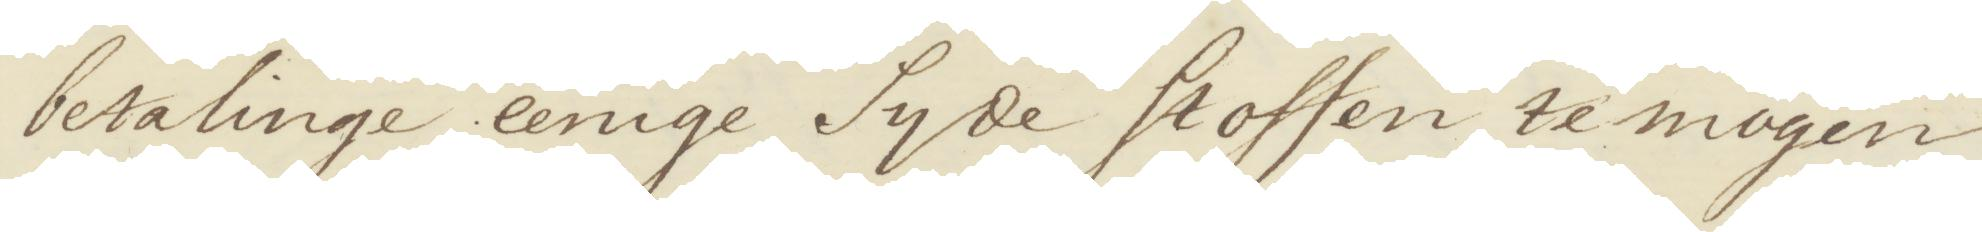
betalinge eenige syde stoffen te mogen
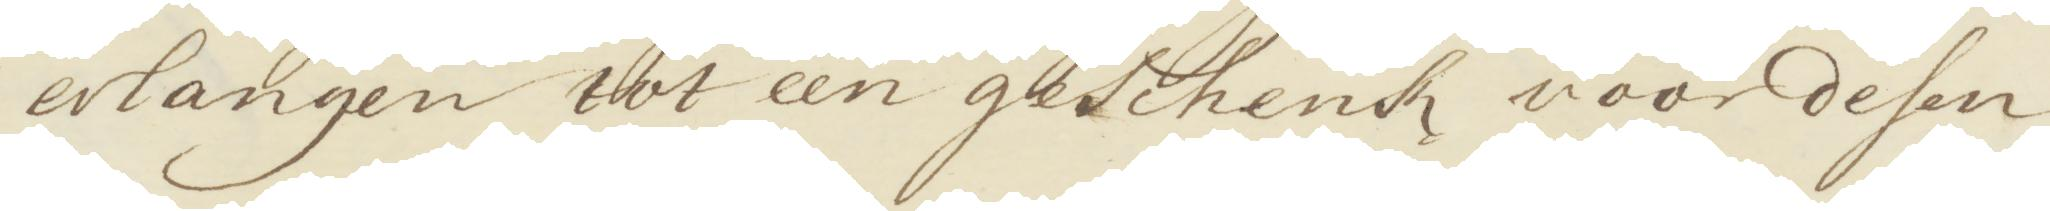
erlangen tot een geschenk voor desen
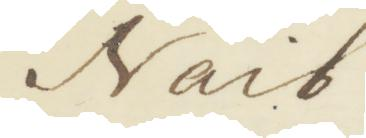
Naib
